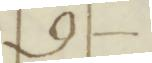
9 —
